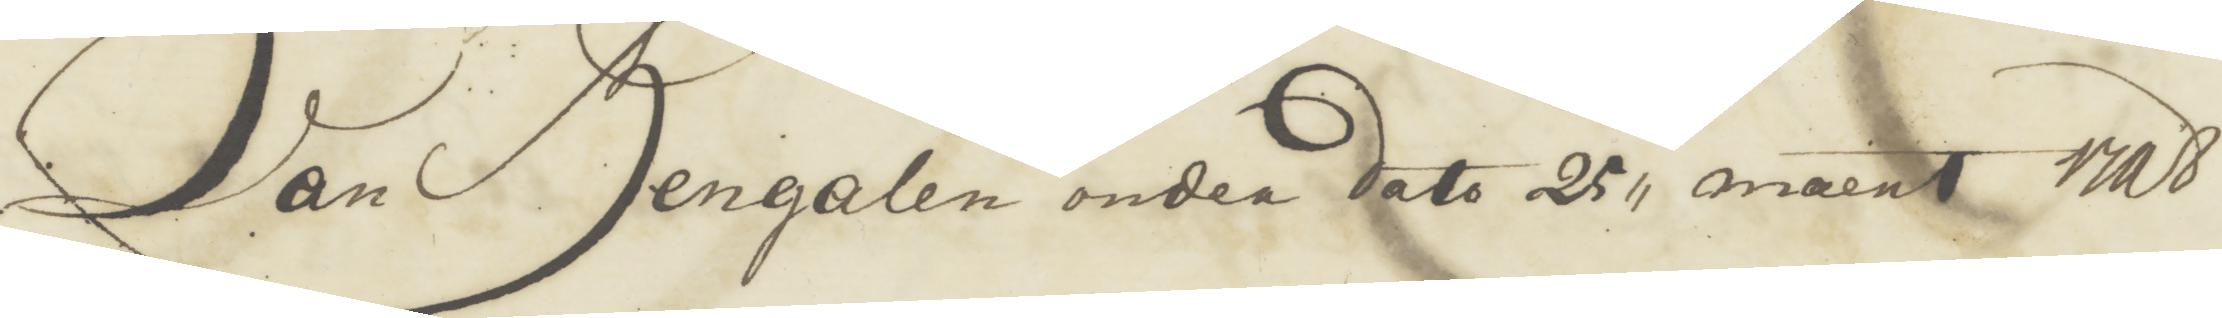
Van Bengalen onder dato 25„' maart 1748
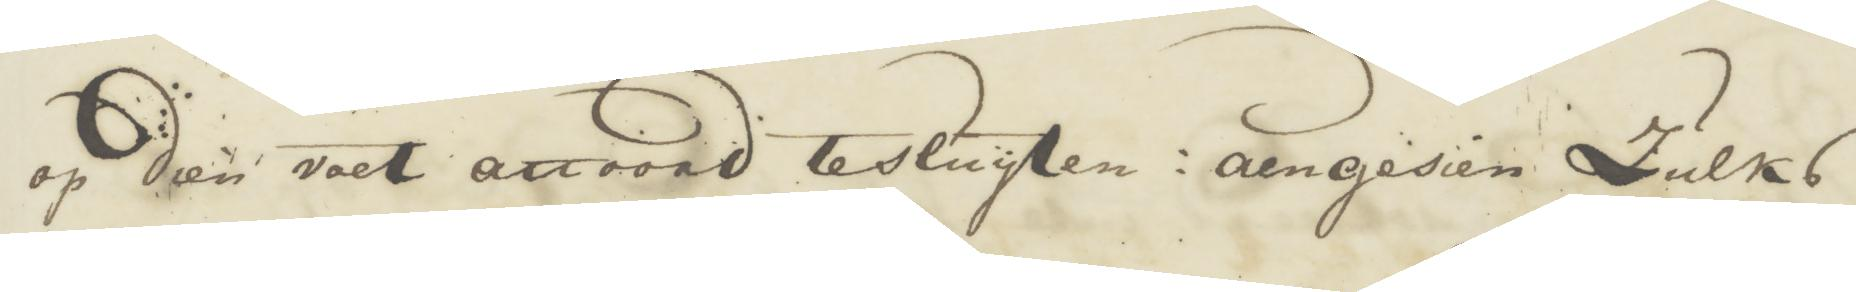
op dien voet accoord te sluijten: aengesien zulks
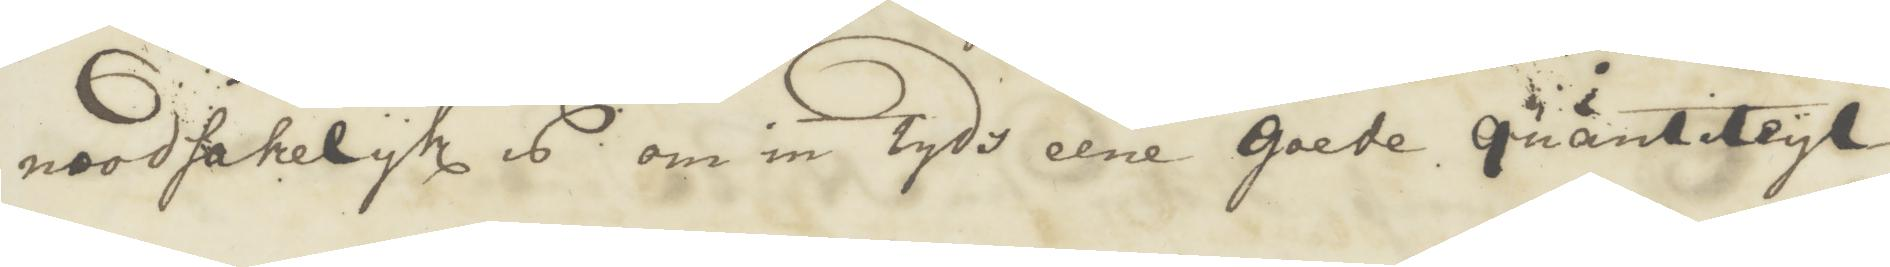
noodsakelijk is om in tijds eene goede quantiteijt
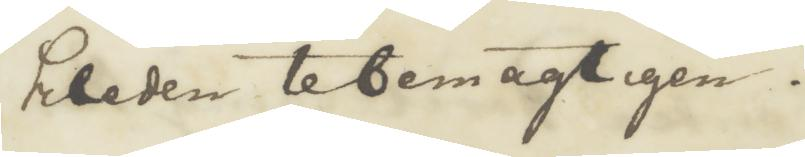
kleden te bemagtigen.
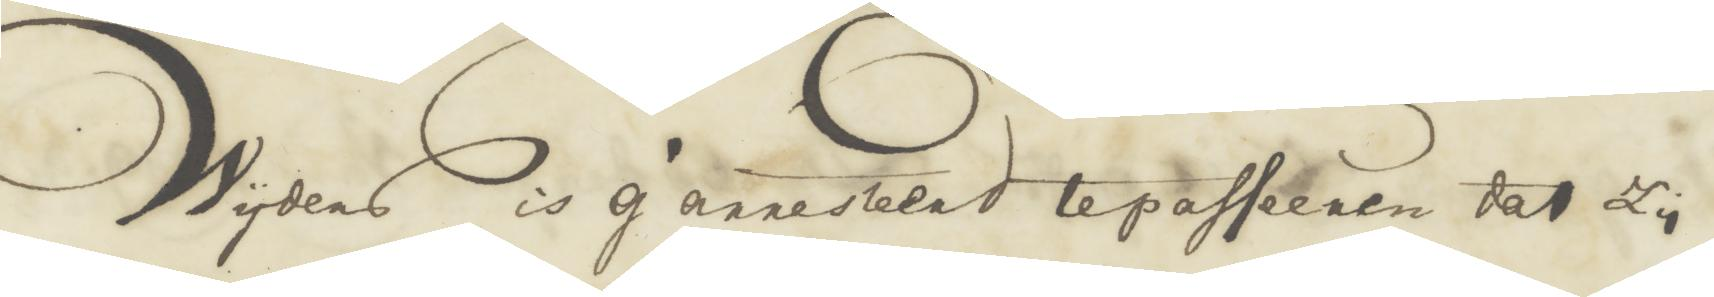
Wijders en g’arresteerd te passeeren dat zij
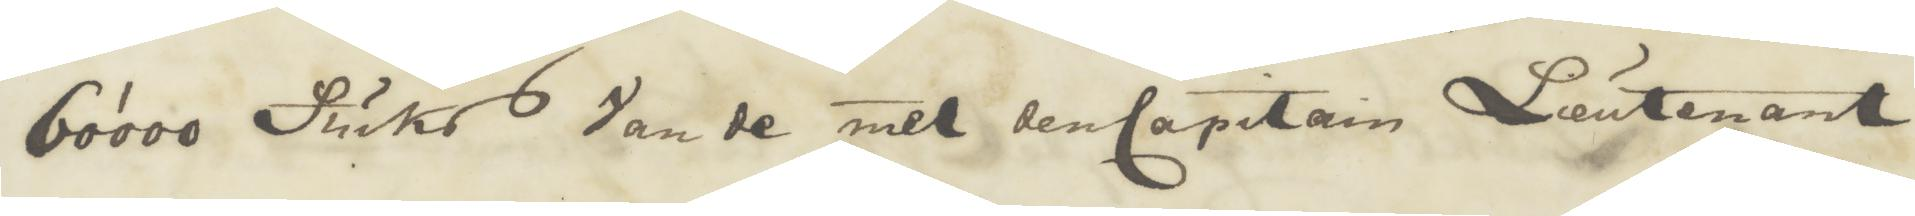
60'000 stuks van de met den Capitain Lieutenant
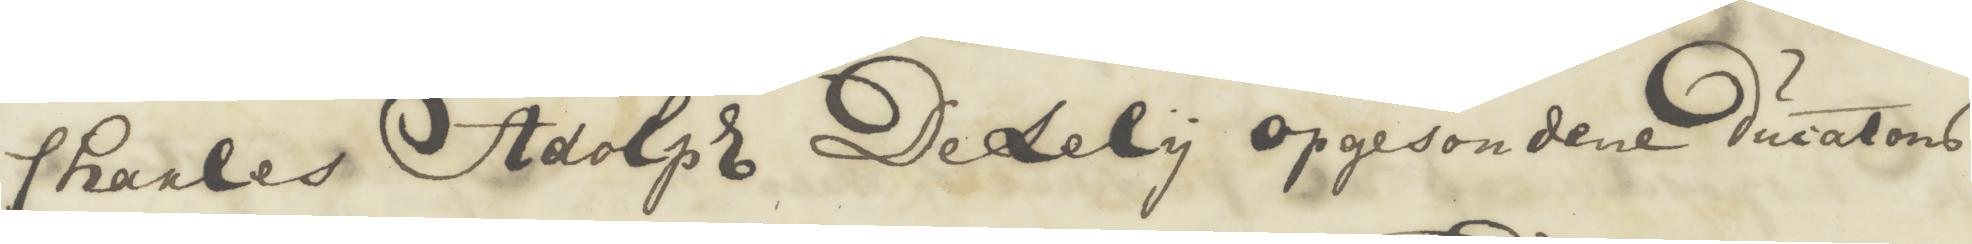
Charles Adolph DeLelij opgesondene ducatons
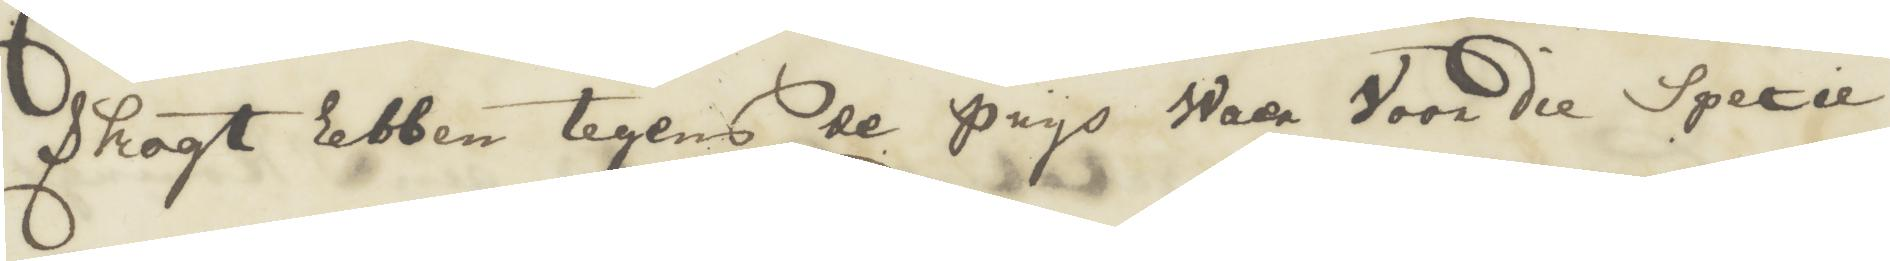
verkogt hebben tegens de prijs waer voor die specie
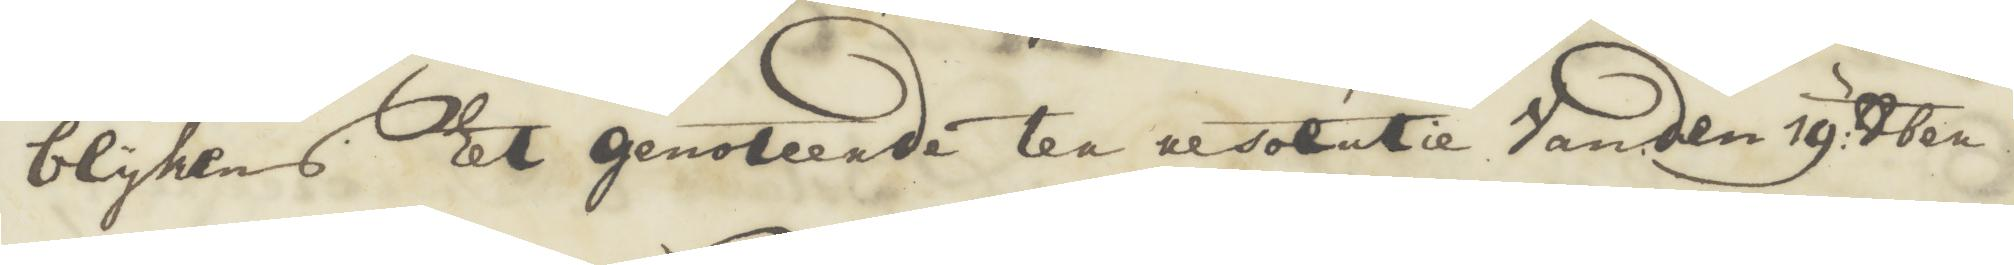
blijkens het genoteerde ter resolutie van den 19:' 8ber
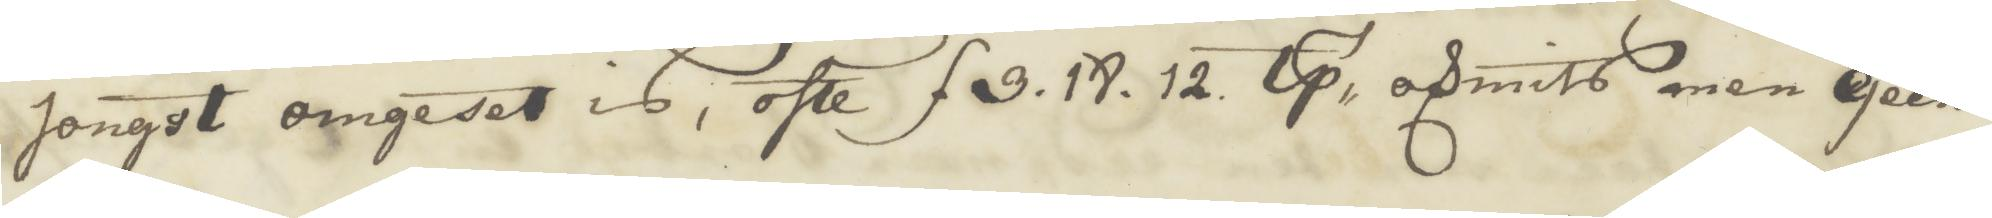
jongst omgeset is, ofte ƒ3.18.12. tp„s overmits men geen
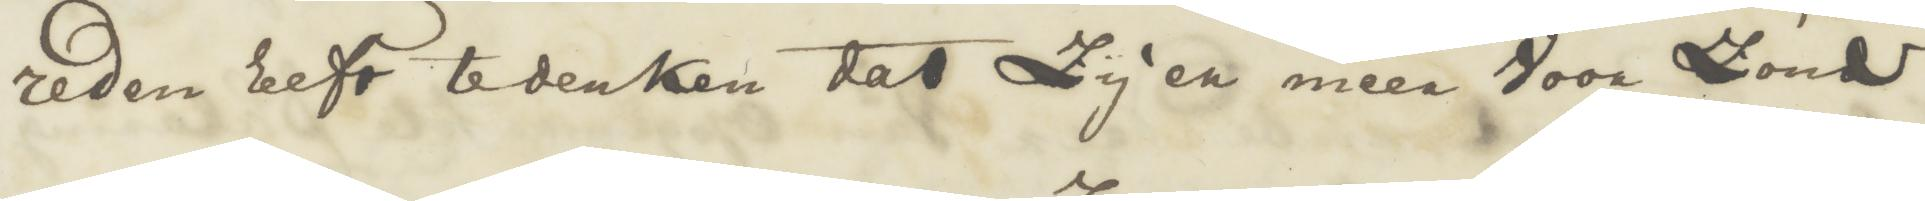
reden heeft te denken dat zij er meer voor zoude
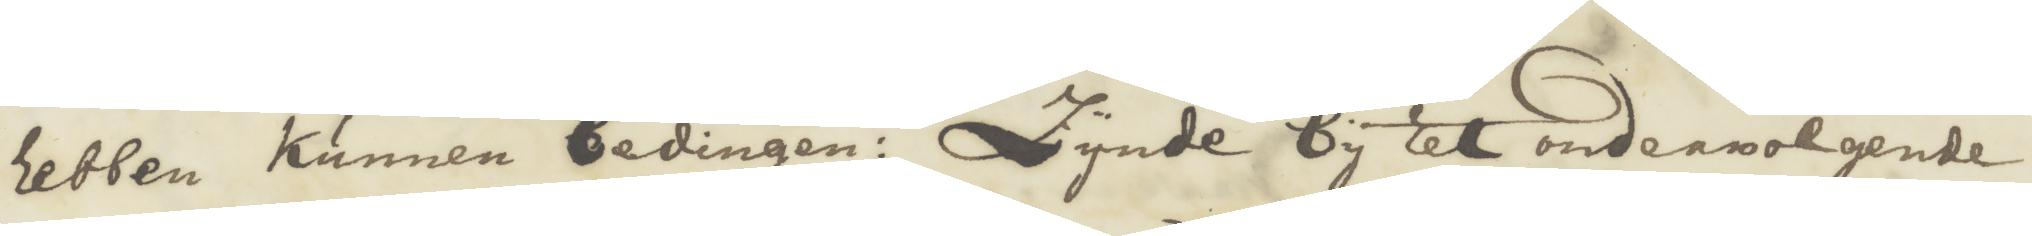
hebben kunnen bedingen: zijnde bij het ondervolgende
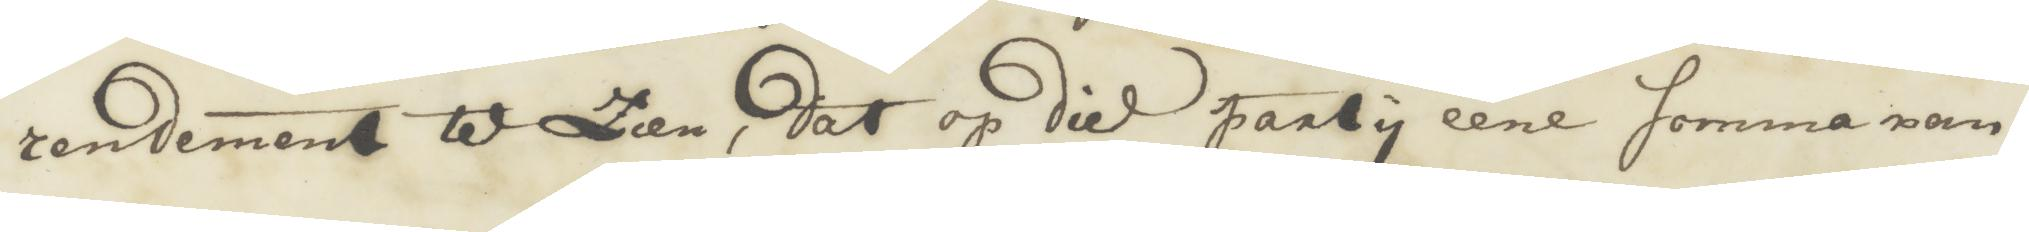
rendement te zien, dat op die partij eene somma van
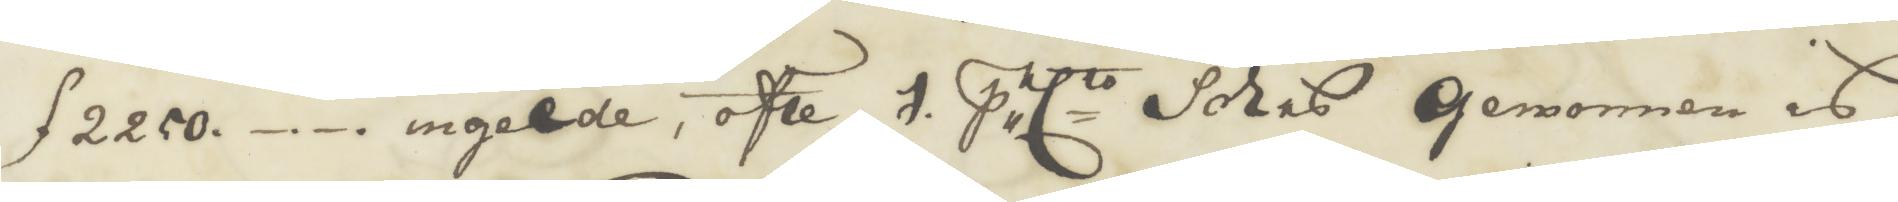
ƒ2250. —. — . in gelde, ofte 1. p„rC=to schrs gewonnen is
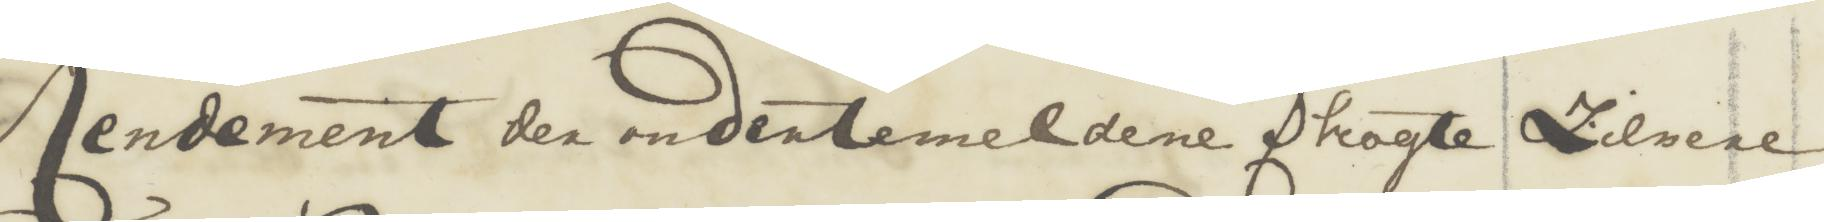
Rendement der ondertemeldene verkogte zilvere
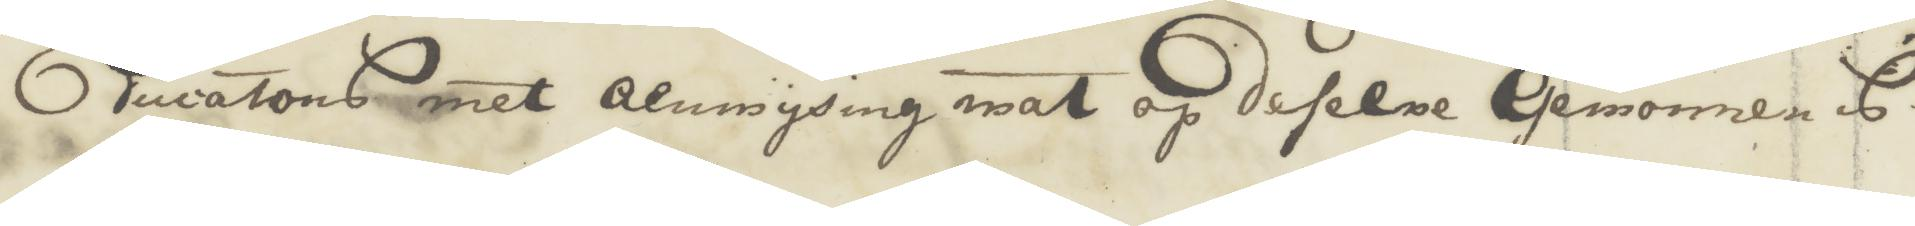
decatons met aenwijsing wat op deselve gewonnen is
